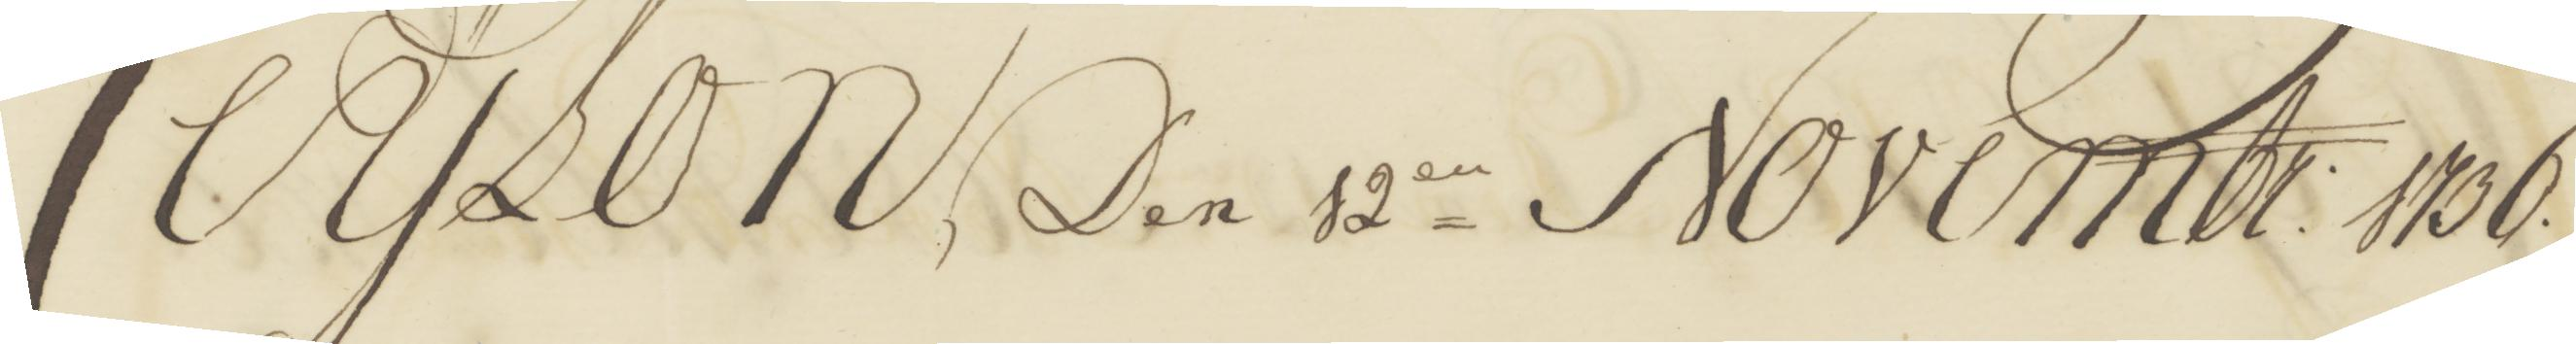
Ceijlon, Den 12=en Novembr: 1736.
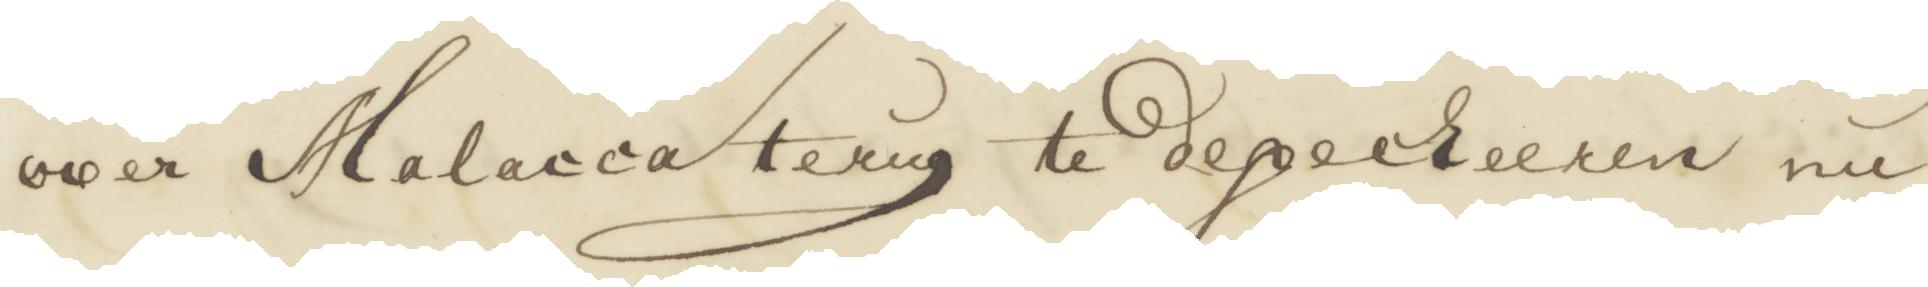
over Malacca terug te depecheeren nu
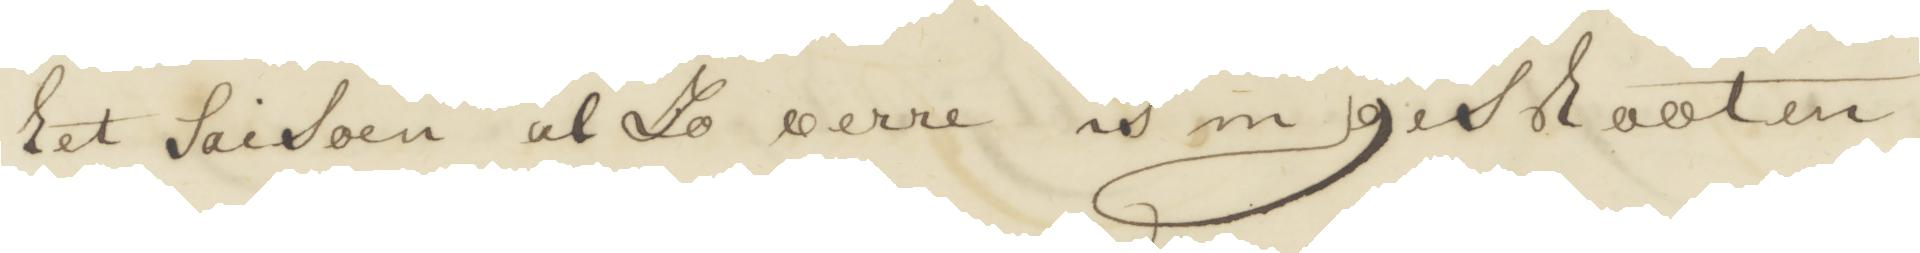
het saisoen al Zo verre is in geschooten,
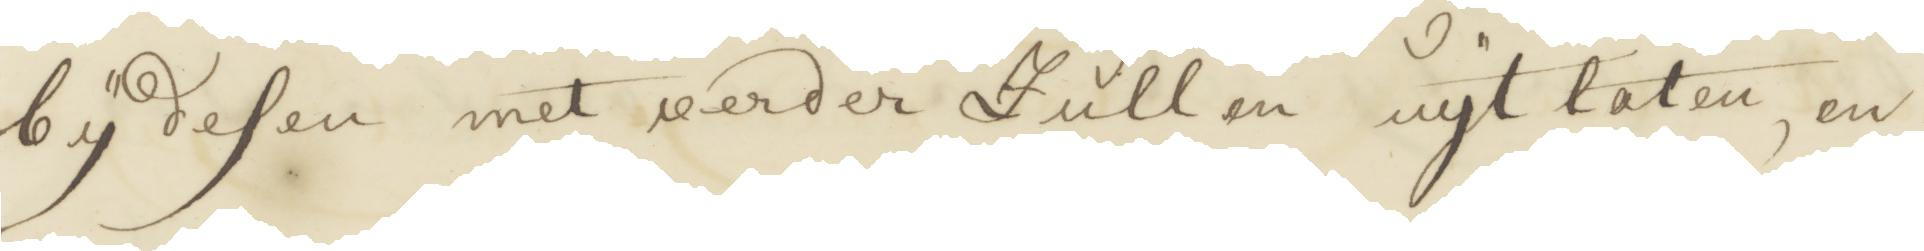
bij desen niet verder Zullen uijt laten, en
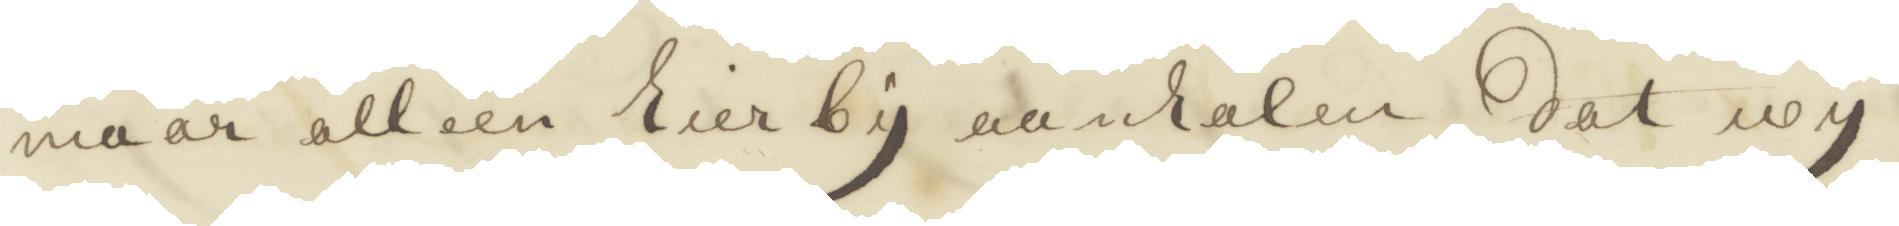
maar alleen hier bij aanhalen, dat wij
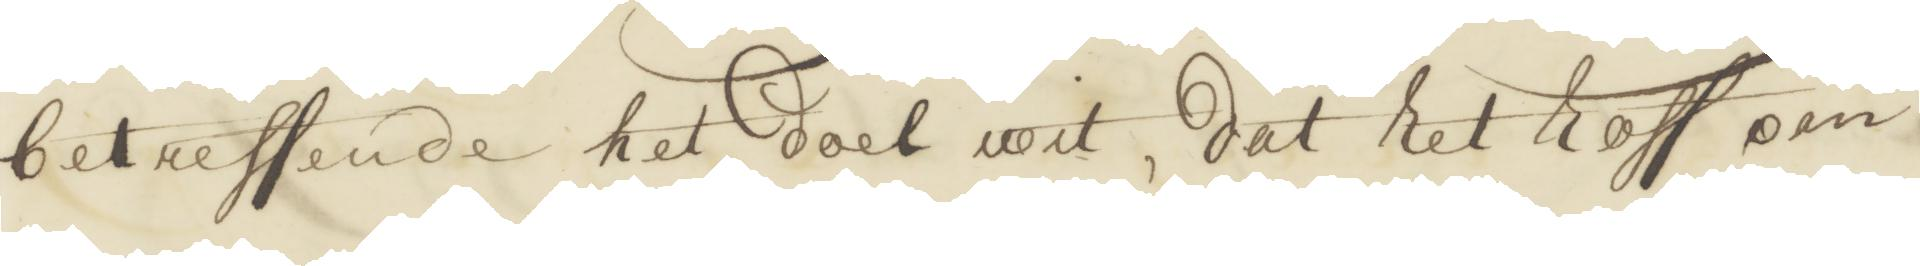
betreffende het doel wit, dat het hoff om
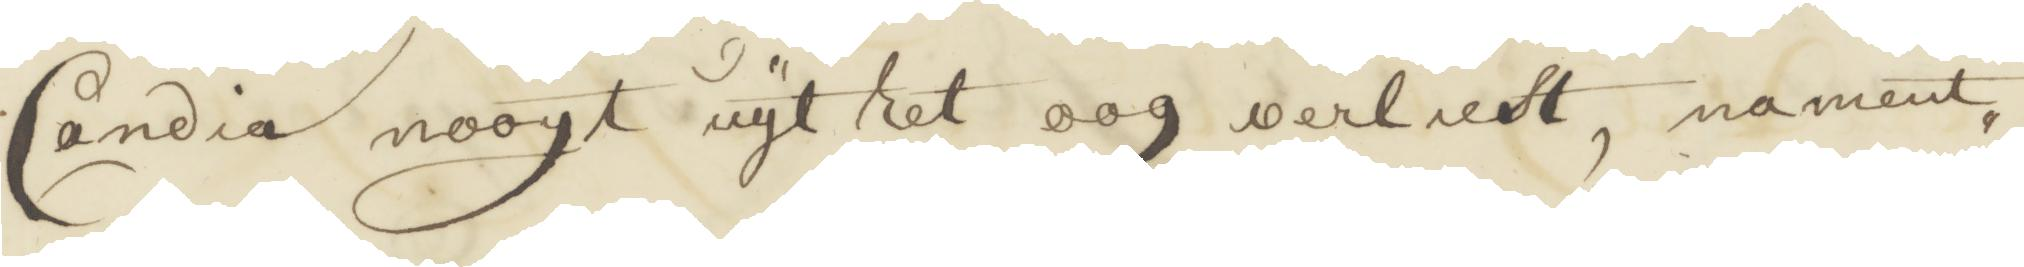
candia nooijt uijt het oog verliest, nament„
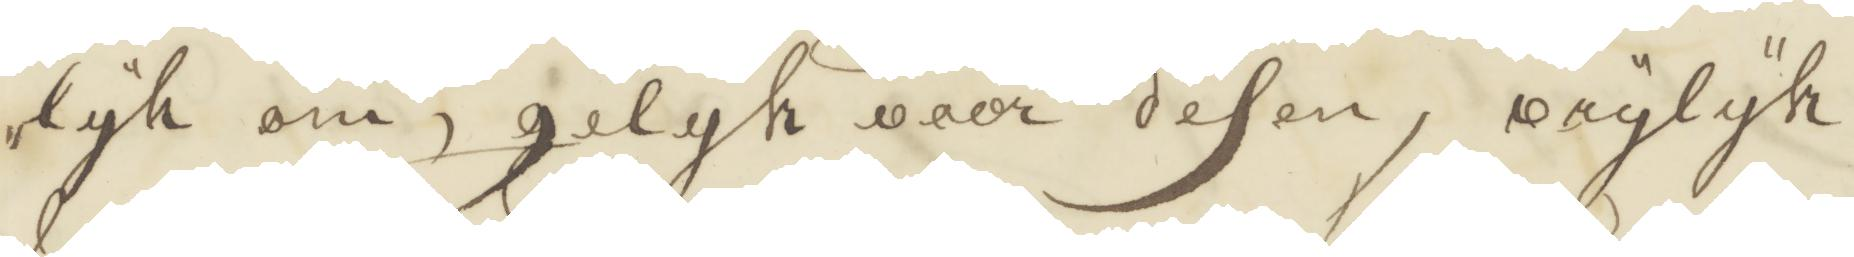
„lijk om, gelijk voor desen, vrijlijk
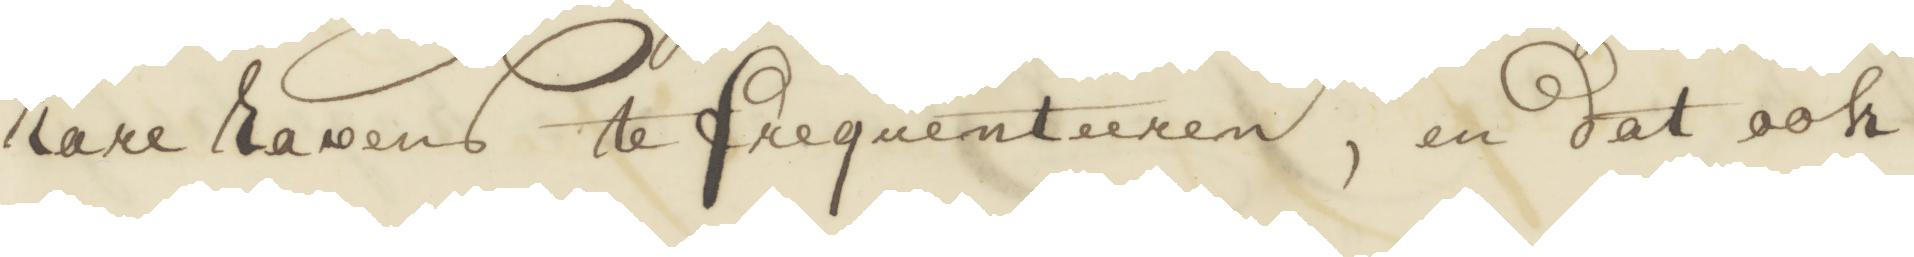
hare havens te frequenteeren, en dat ook
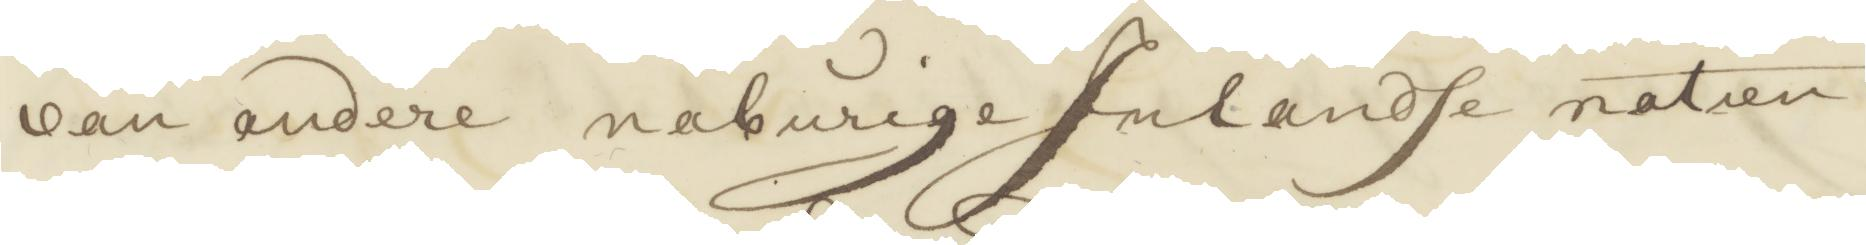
van andere naburige Jnlandse natien
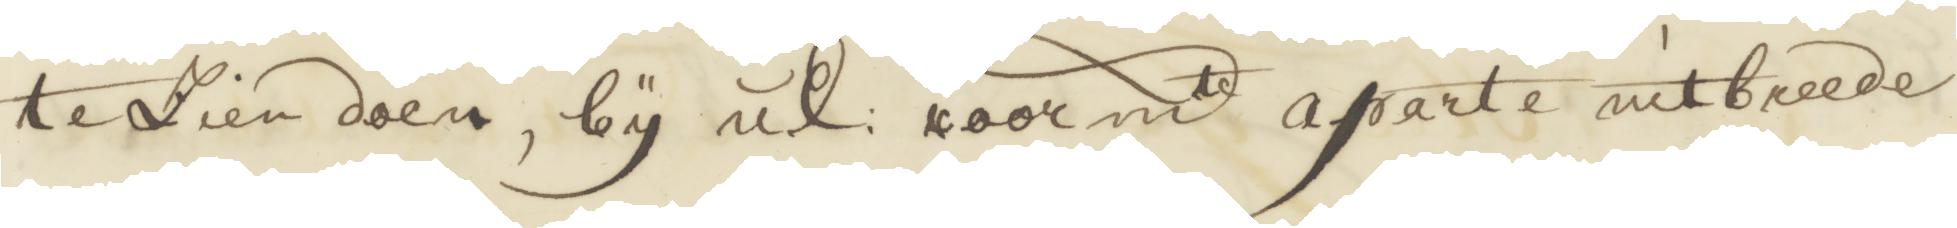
te Zien doen, bij uE: voorm:te aparte uitbreede
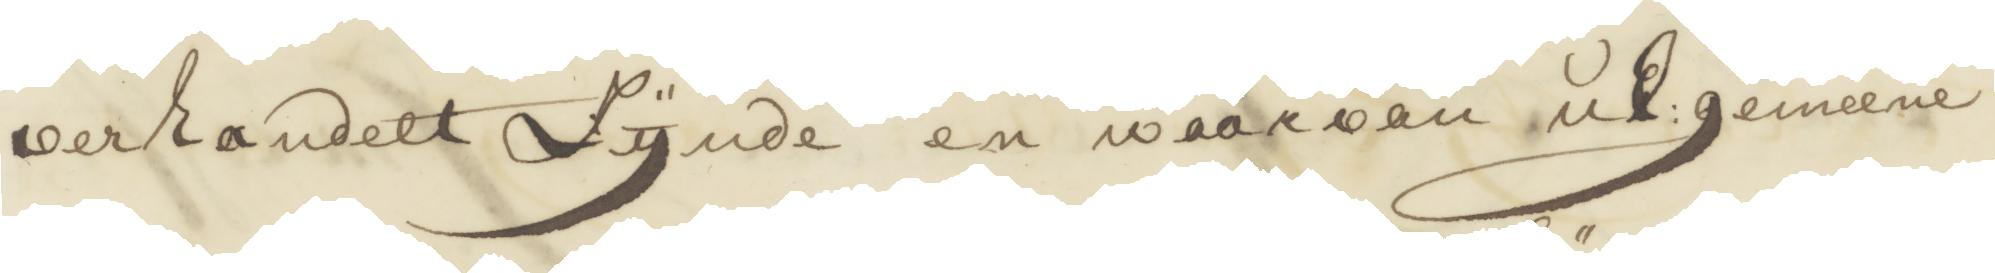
verhandelt Zijnde en waarvan uE: gemeene
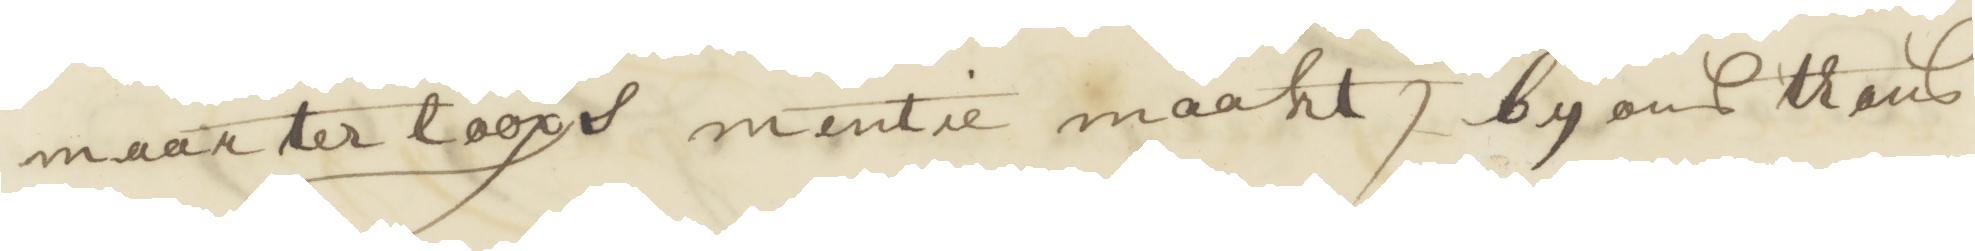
maar ter loops mentie maakt, bij ons thans
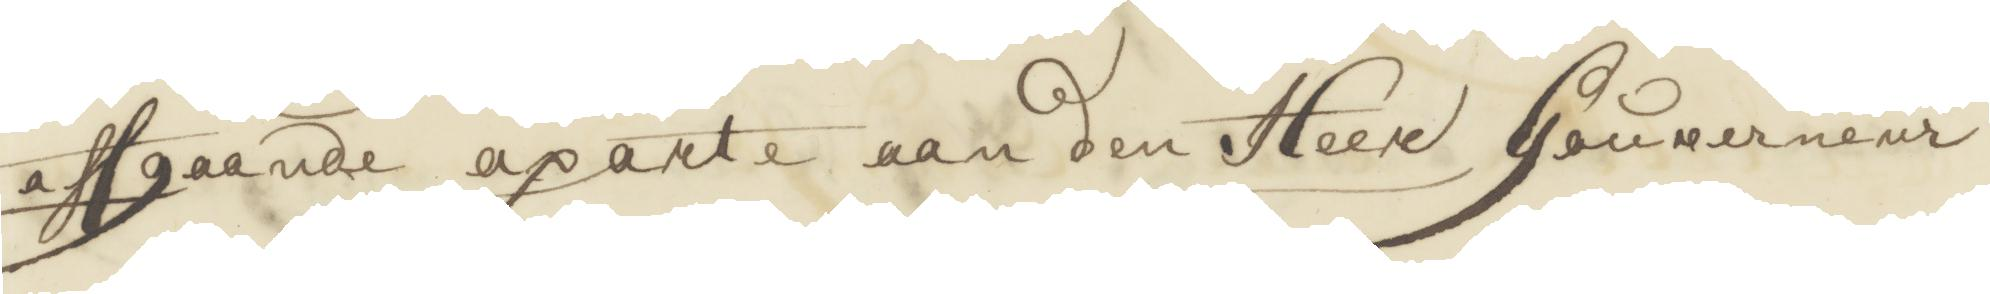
affgaade aparte aan den Heer Gouverneur
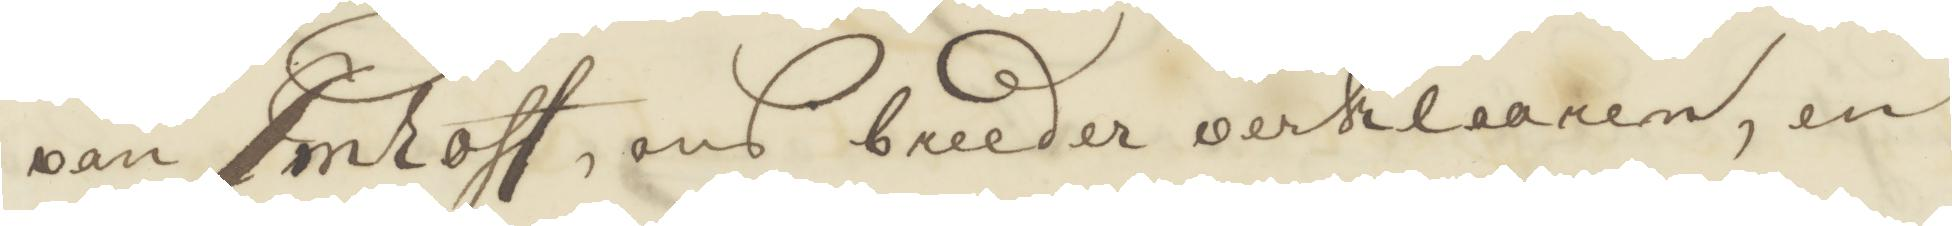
van Imhoff, ons breeder verklaaren, en
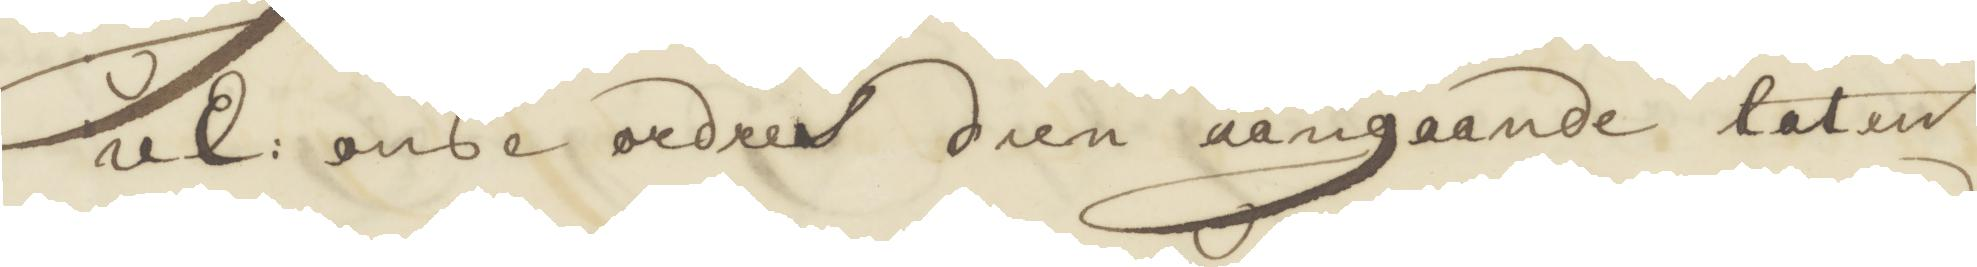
uE: onse ordres dien aangaande laten
